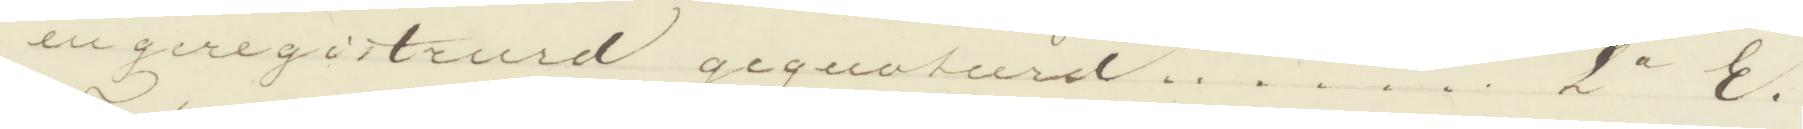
en geregistreerd gequoteerd . . . . . . . La E.
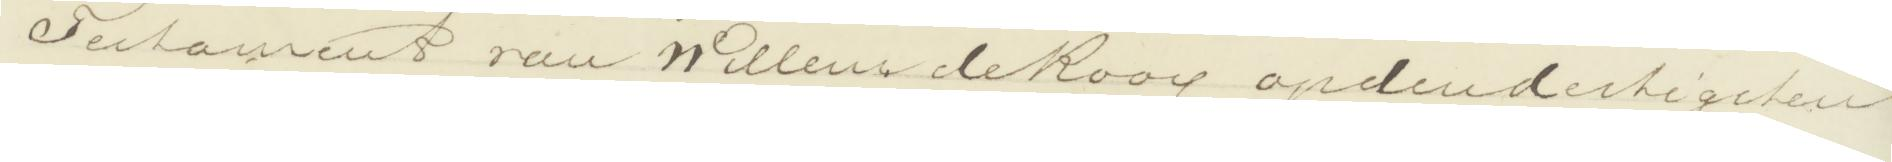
Testament van Willem de Rooy op den dertigsten
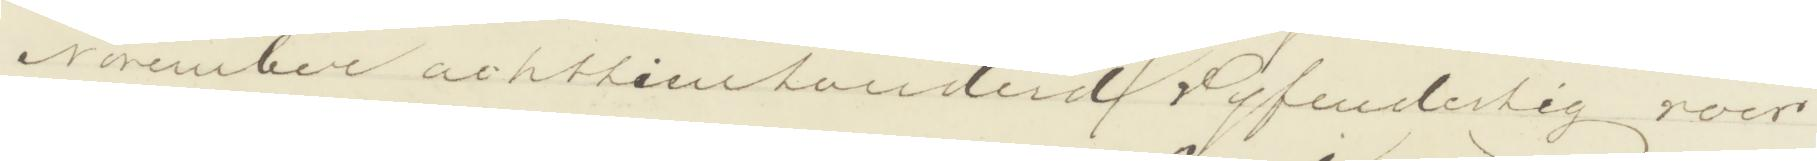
November achttienhonderd Vyfendertig voor
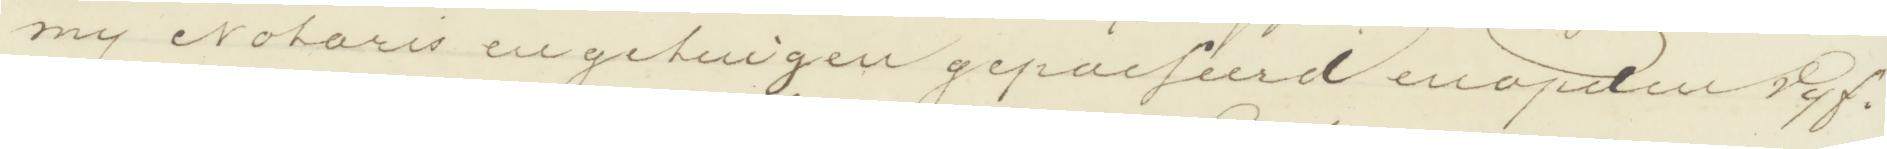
my Notaris en getuigen gepasseerd en opden vyf„
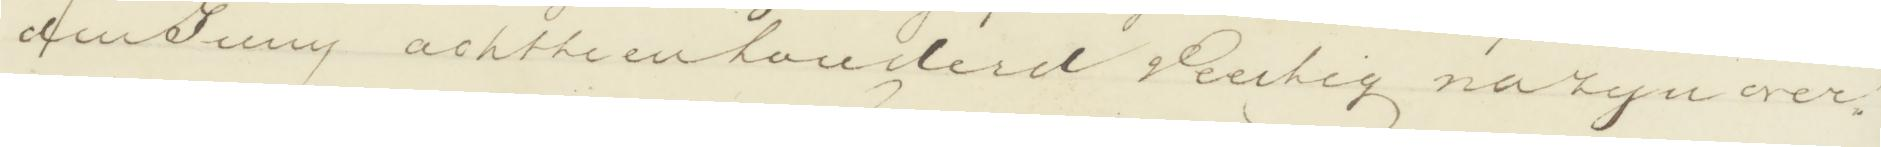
=den Juny achttienhonderd Veertig na zyn over„
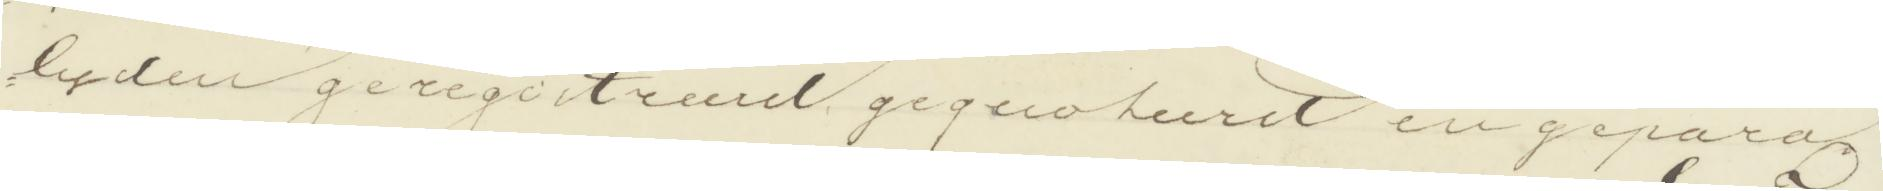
=lyden geregistreerd gequoteerd en gepara
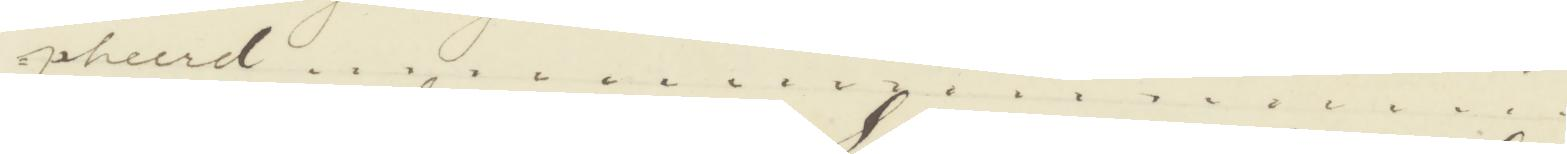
=pheerd . . . . . . . . . . . . . . . . . . . . . . La F.
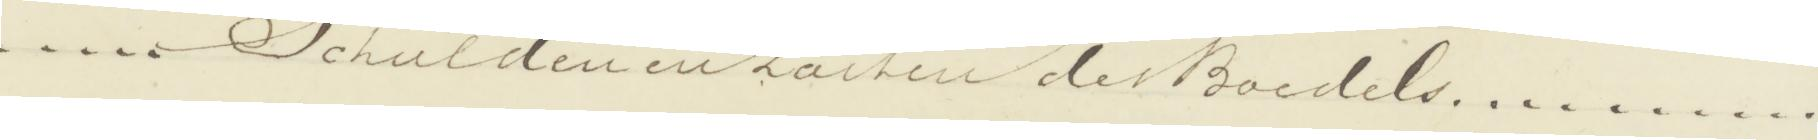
. . . . . . Schulden en Lasten der Boedels . . . . . . . . . .
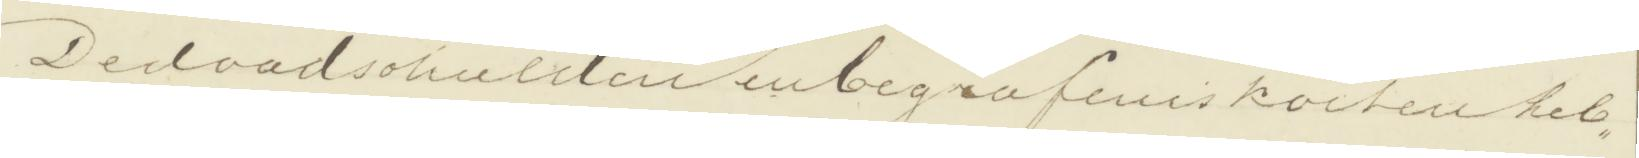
De doodschulden en begrafenis kosten heb„
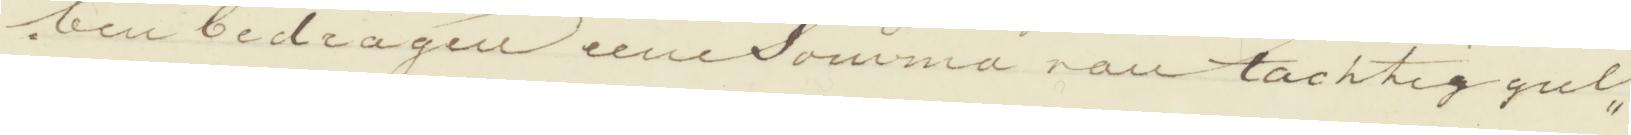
=ben bedragen eene somma van tachtig gul„
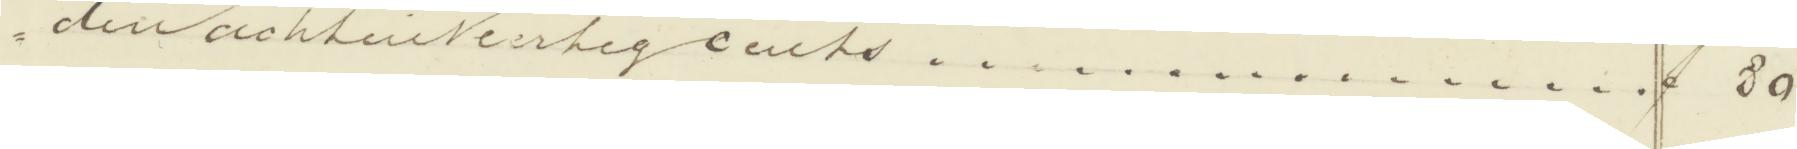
=den achtenveertig cents . . . . . . . . . . . . . . . . ƒ 89 48
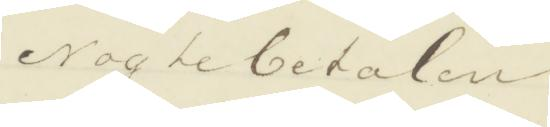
Nog te betalen
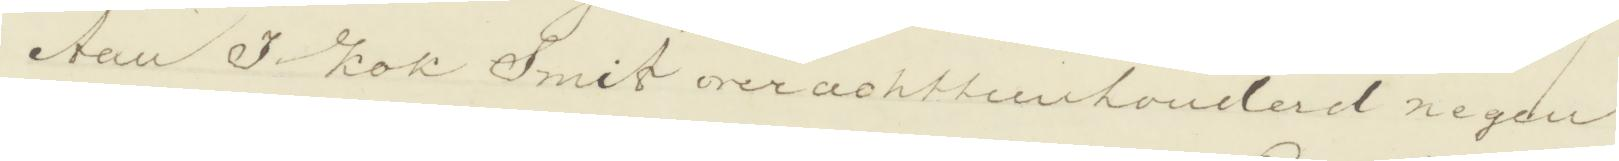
Aan J Kok Smit over achttienhonderd negen
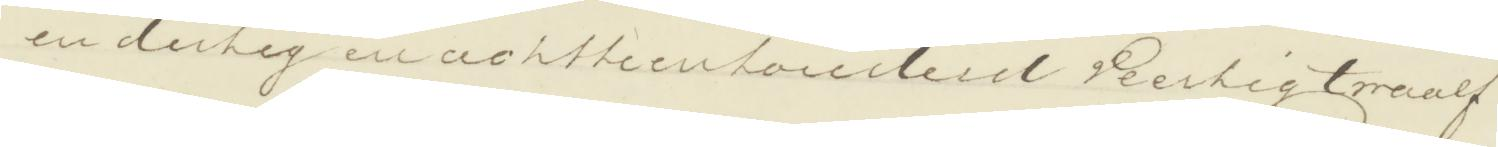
en dertig en achttienhonderd Veertig twaalf
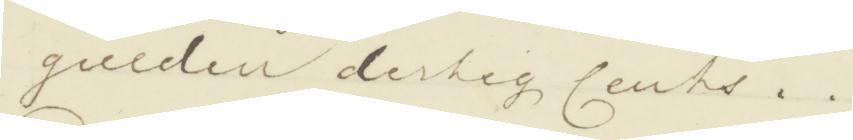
gulden dertig Cents . . . . . . . . . . . . . . . . . „
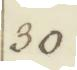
12 30
